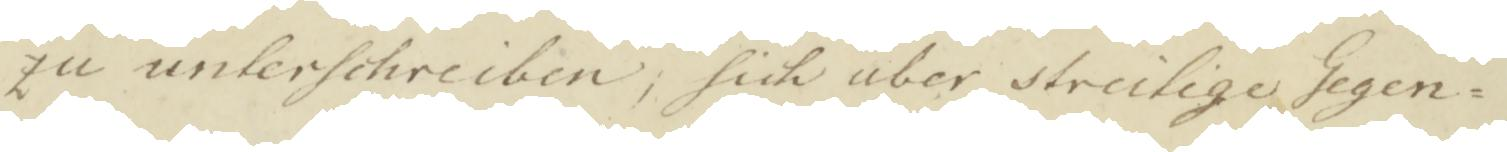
zu unterschreiben; sich über streilige Gegen=
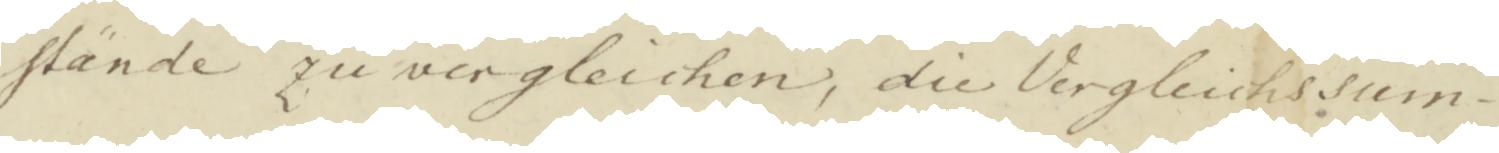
stände zu vergleichen, die Vergleichs sum=
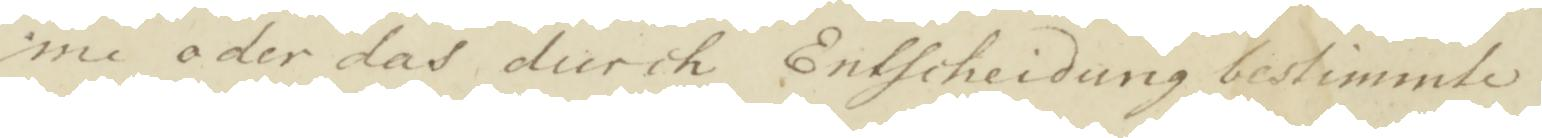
me oder das durch Entscheidung bestimmte
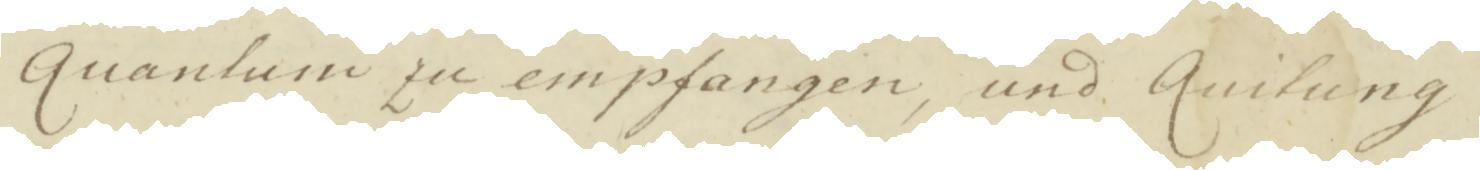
quantum zu empfangen, und Quitung
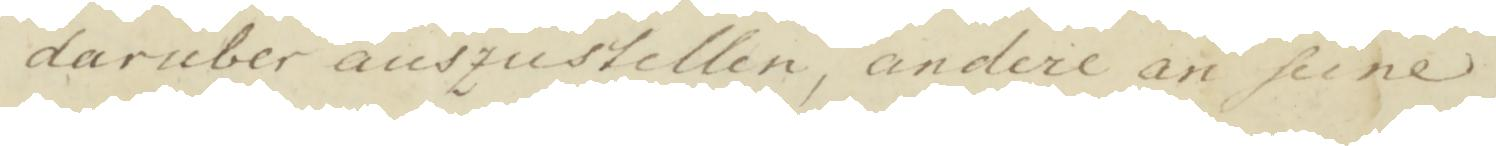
darüber auszustellen, andere an seine
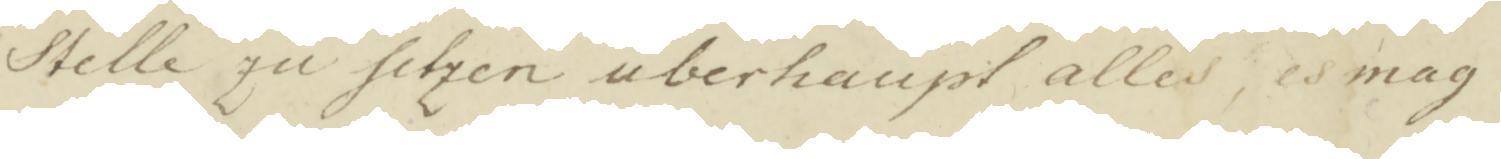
stelle zu setzen überhaupt alles, es mag
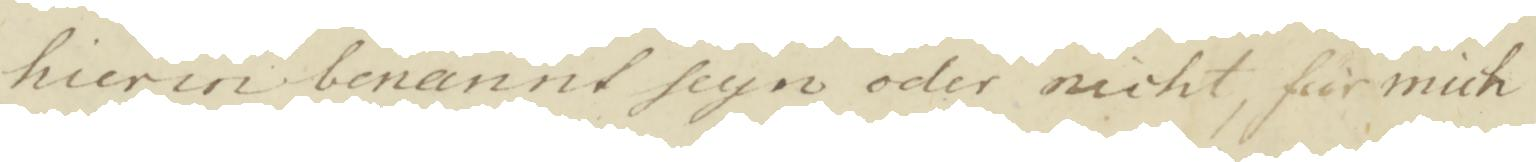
hierin benannt seyn oder nicht, für mich
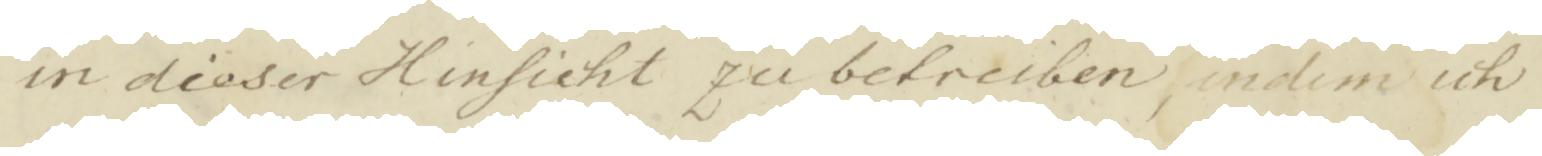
in dieser Hinsicht zu betreiben, indem ich
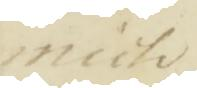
mich
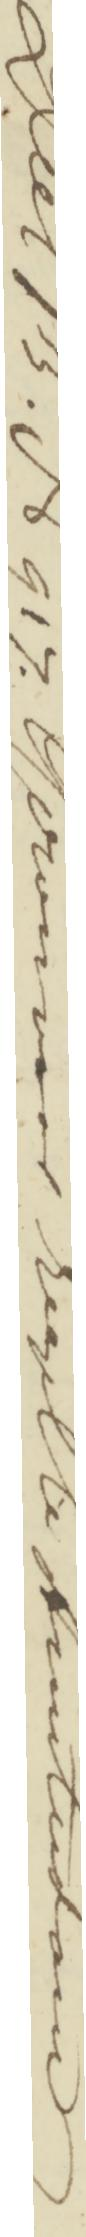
Deel 13. No 917. Geron voor regel te Amsterdam
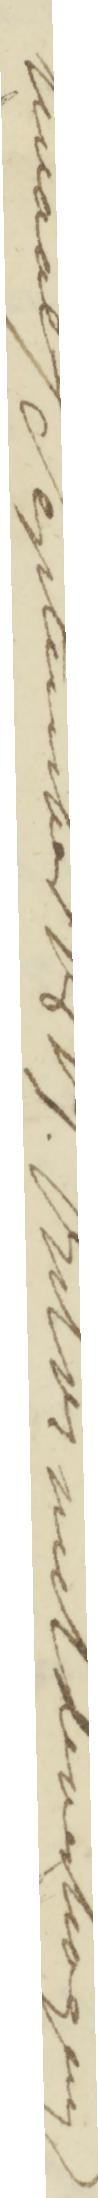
twaalf September 1807. Onder met de verhooging
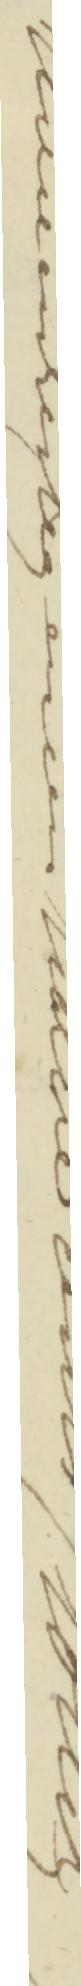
vierenzestig en een halve cents Covrich
